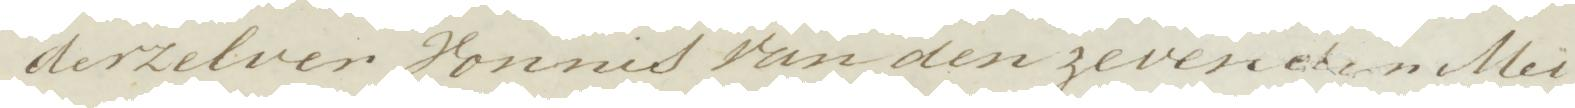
derzelver Vonnis van den zevenden Mei
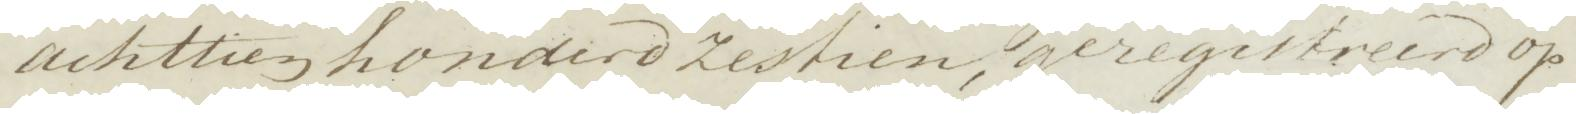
achttien honderd zestien, geregistreerd op
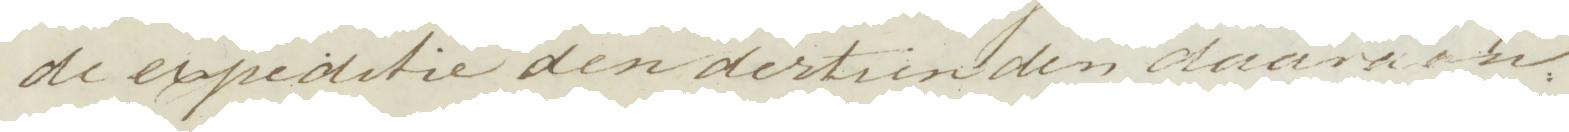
de expeditie den dertienden daaraan=
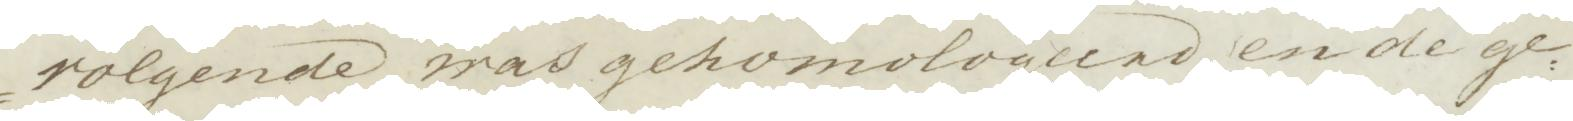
=volgende, was gehomologeerd, en de ge=
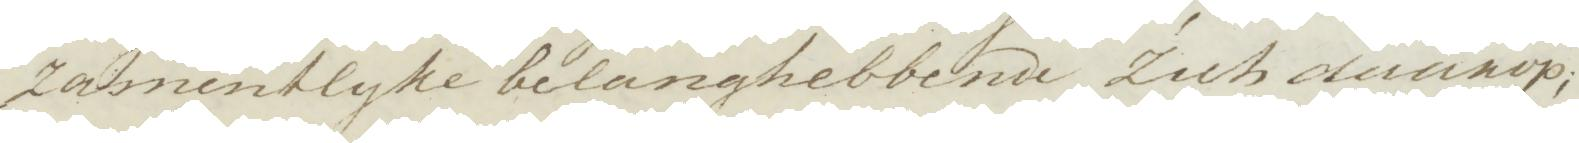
=zamentlyke belanghebbende zich daarop,
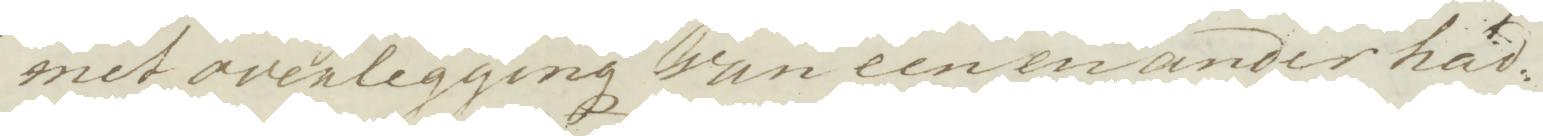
met overlegging van een en ander had=
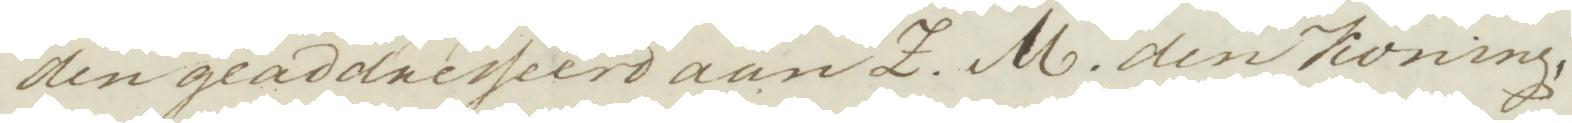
=den geaddresseerd aan Z. M. den Koning,
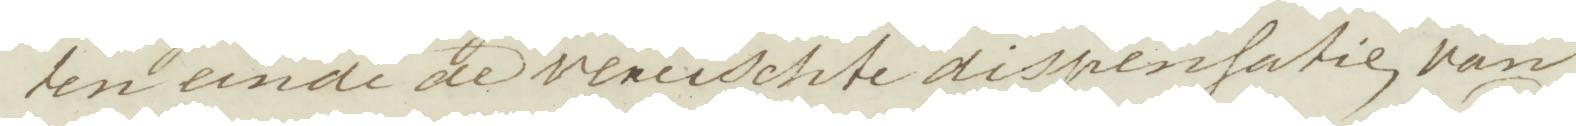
ten einde de vereischte dispensatie van
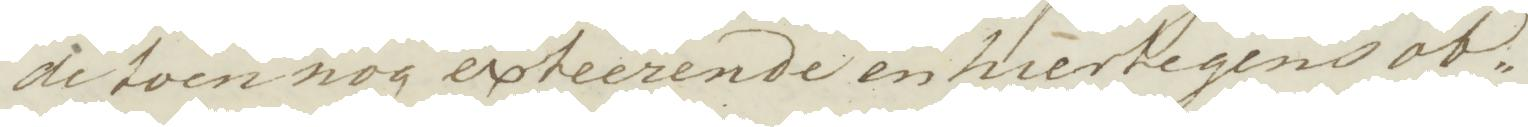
de toen nog exteerende en hiertegens ob„
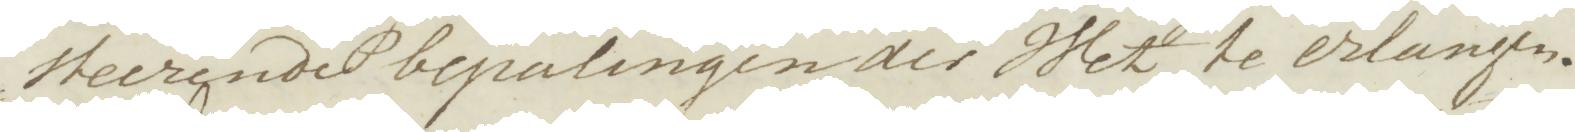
=steerende bepalingen der Wet te erlangen.
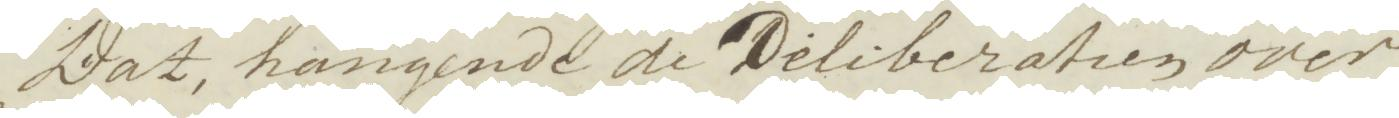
Dat, hangende de Deliberatien over
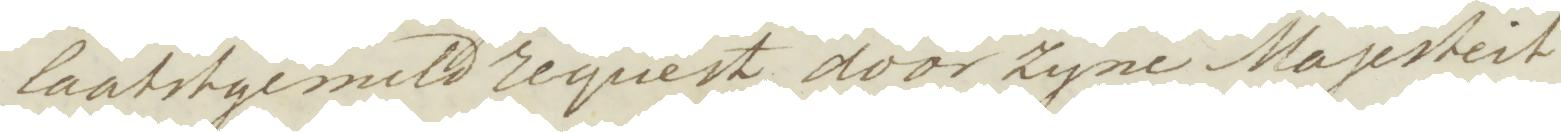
laatstgemeld request door zyne Majesteit
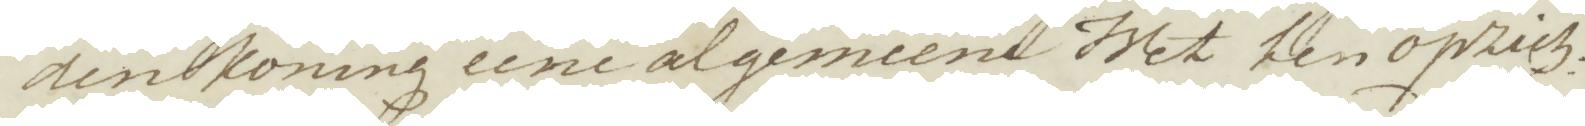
den koning eene algemeene Wet ten opzich:
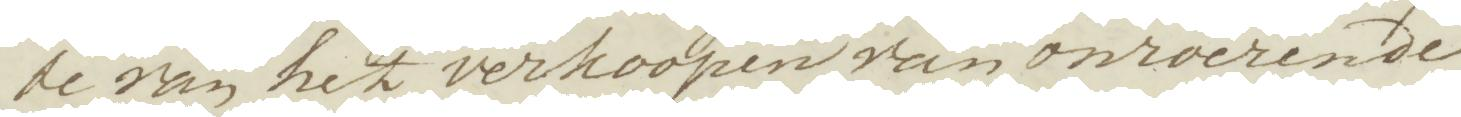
=te van het verkoopen van onroerende
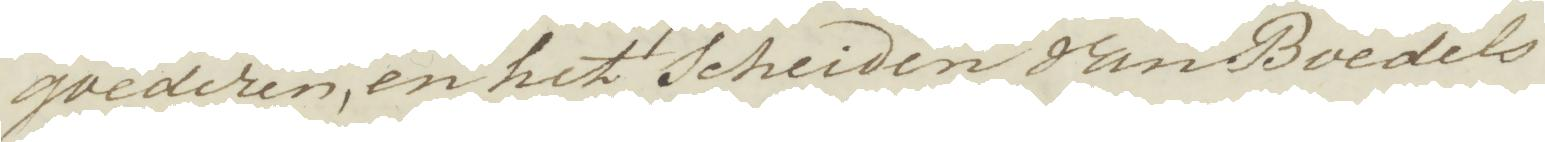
goederen, en het scheiden van Boedels
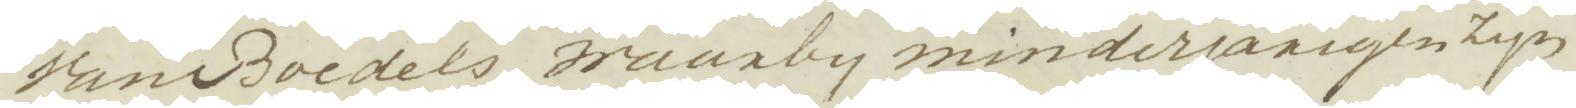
van Boedels, waarby minderjarigen zyn
